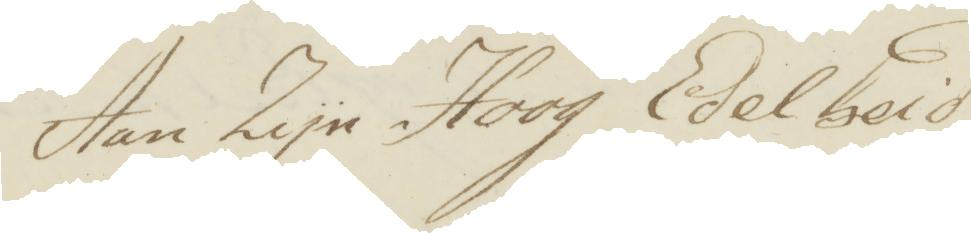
Aan Zijn Hoog Edelheid
